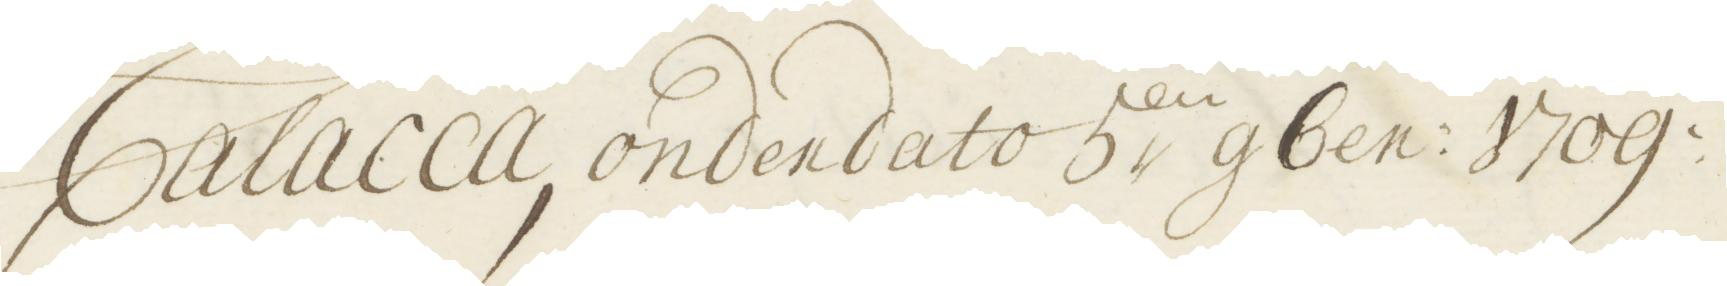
Malacca, onder dato 5„en 9ber: 1709:
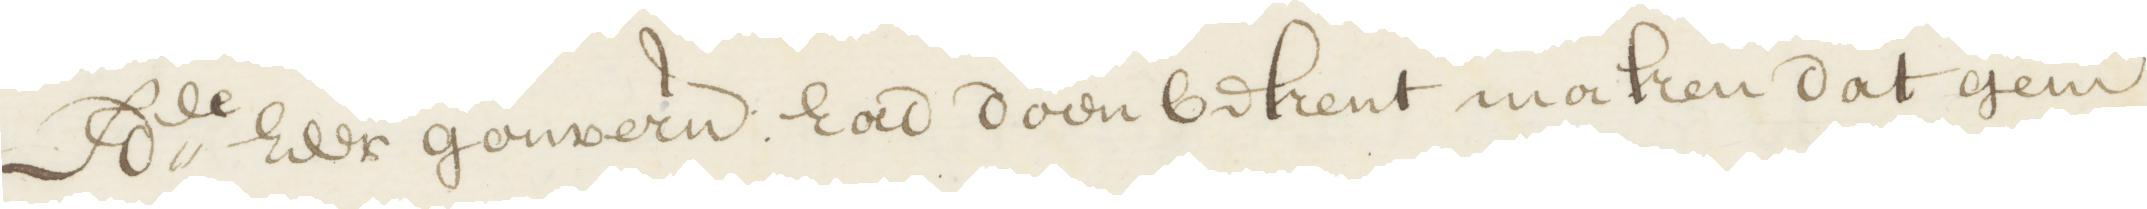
Ed„le heer gouvern: had doen bekent maken dat gem
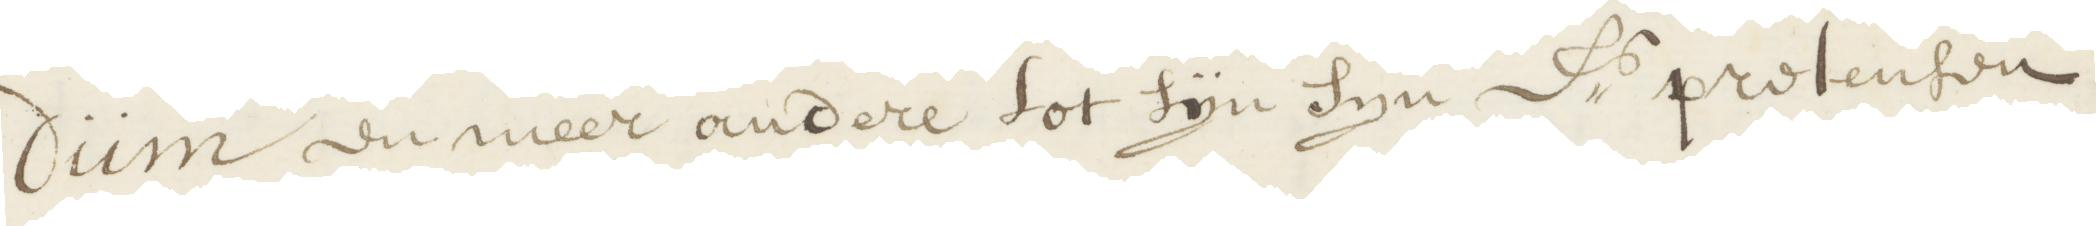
diim en meer andere tot sijn sijn E„s pretensen
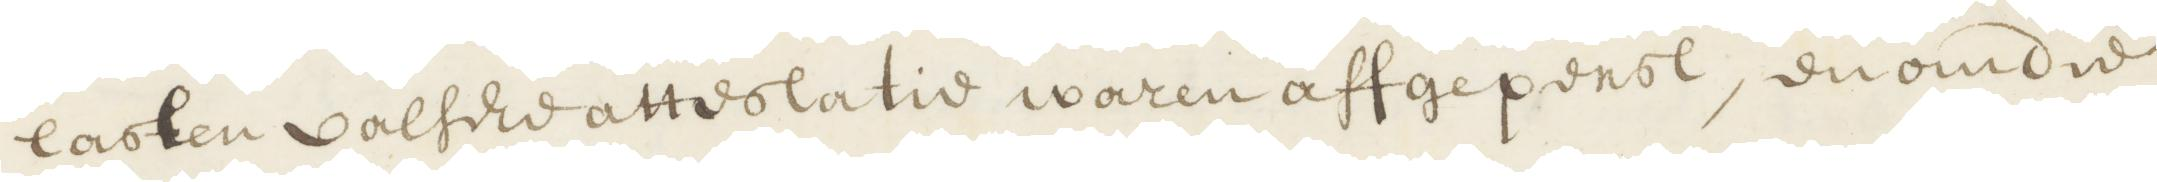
lasten valsche attestatie waren affgeperst, en om die
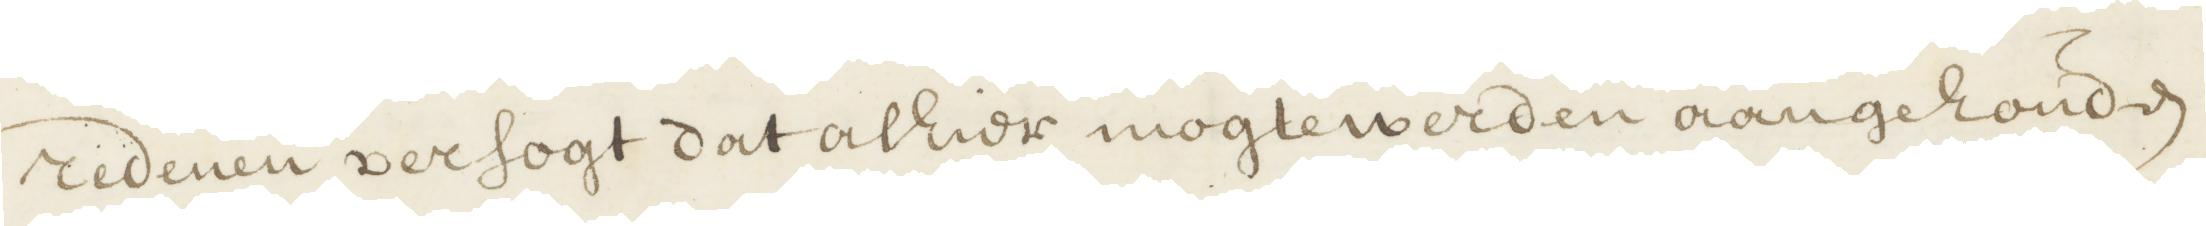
redenen versogt dat alhier mogte werden aangehouden
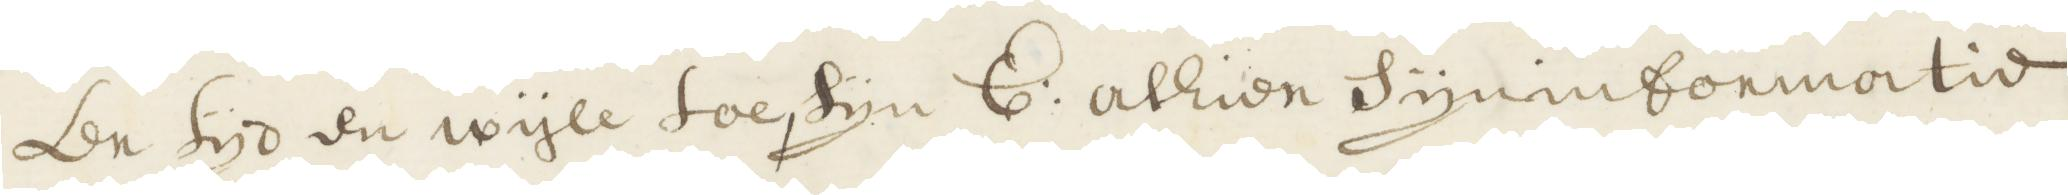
ter tijd en wijle toe, sijn E: alhier sijn informatie
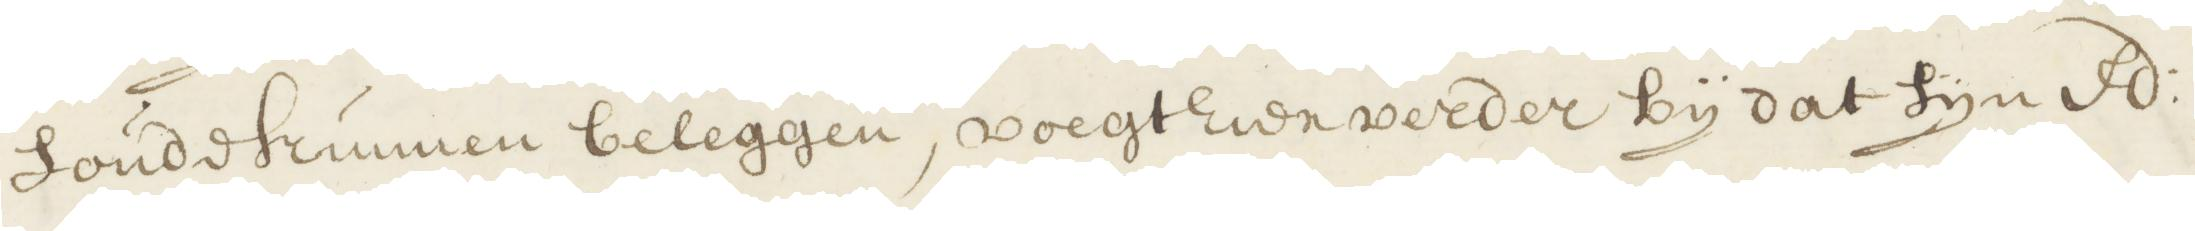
soude kunnen beleggen, voegt hier verder bij dat sijn Ed:
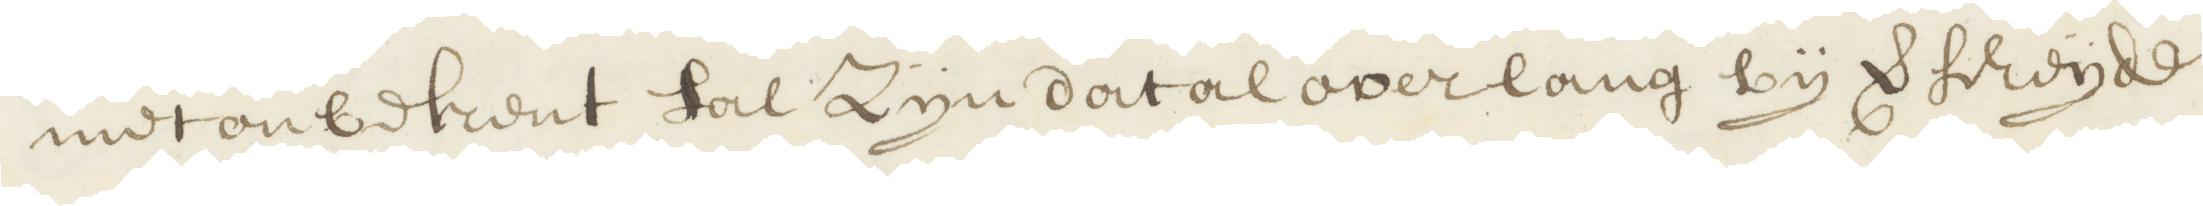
niet onbekent sal zijn dat al overlang bij verscheijde
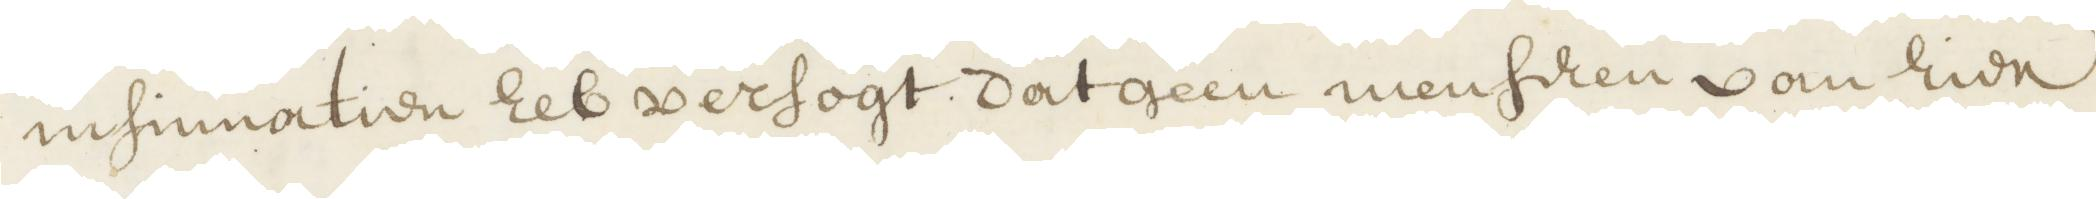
insinuatien heb versogt dat geen menschen van hier
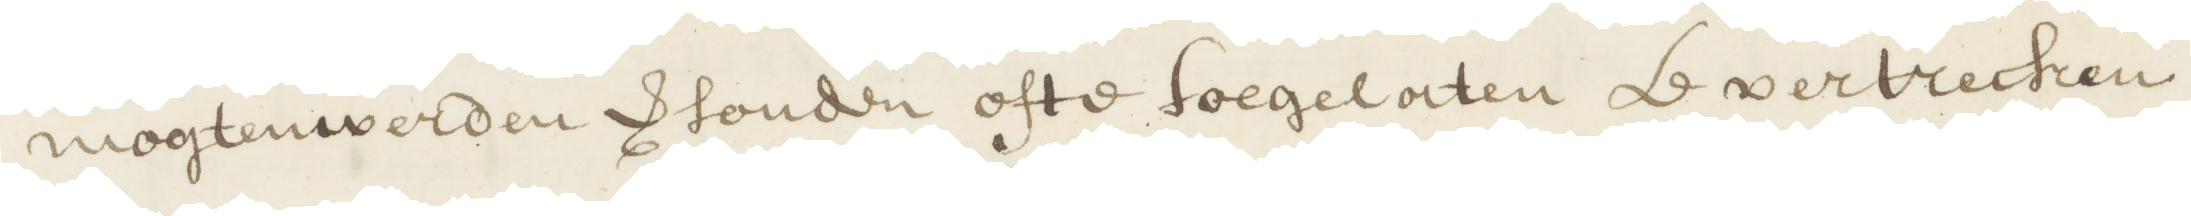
mogten werden versonden ofte toegelaten te vertrecken
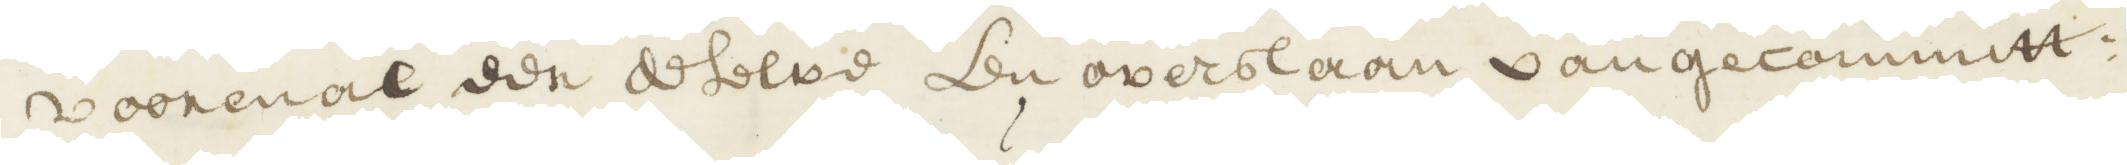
voor en al eer deselve ten overstaan van gecommitts
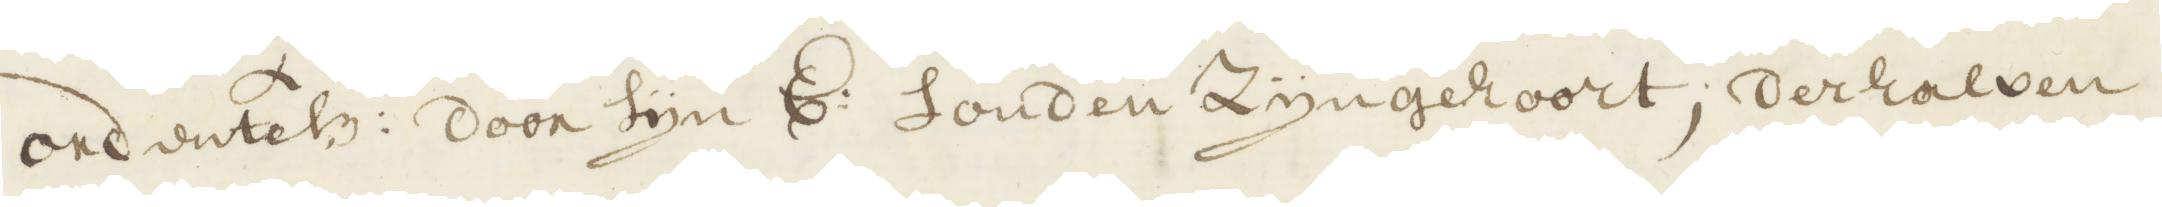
ordentelijk: door sijn E: souden zijn gehoort; derhalven
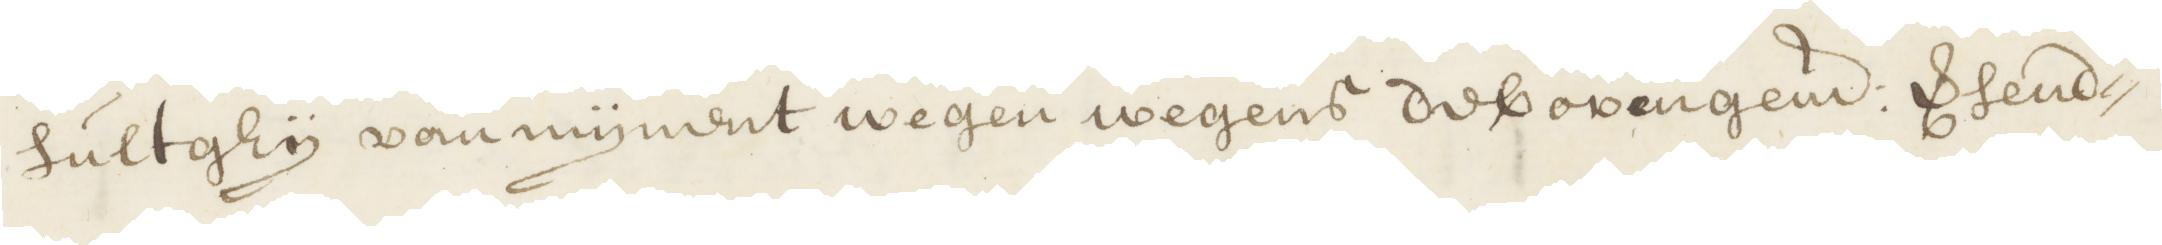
sult ghij van mijnent wegen wegens de bovengem: versend„g
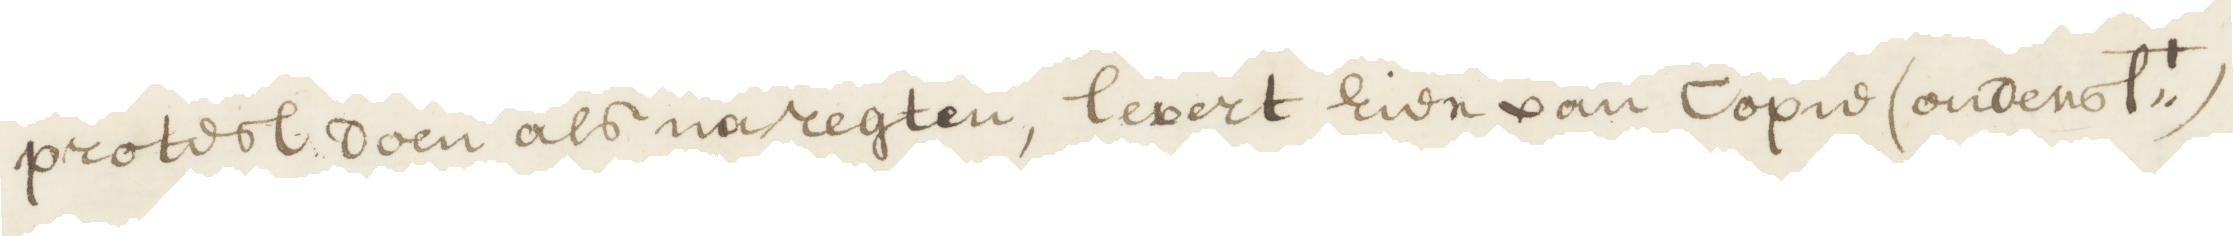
protest doen als na regten, levert hier van Copie (onderst„t)
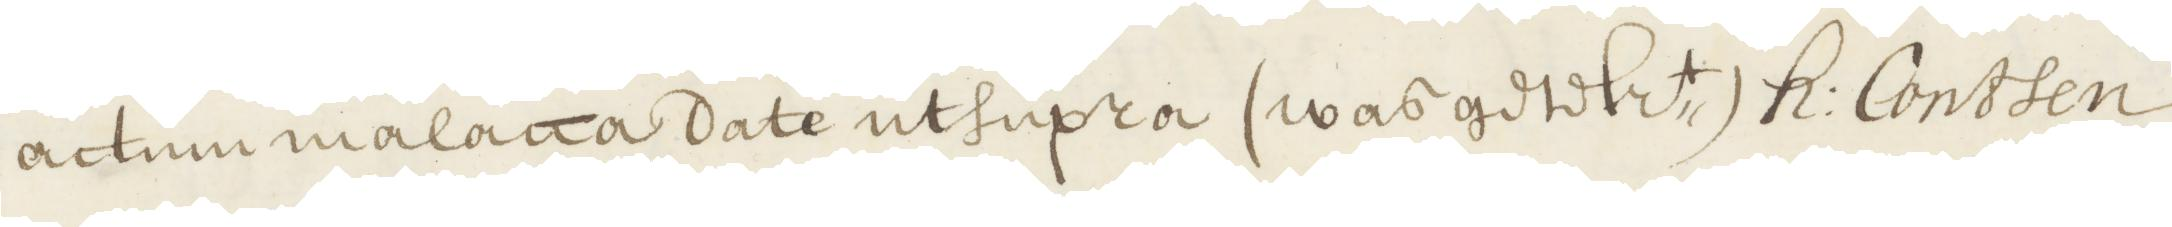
actum malacca date ut supra (was getek:t) H: Contsen
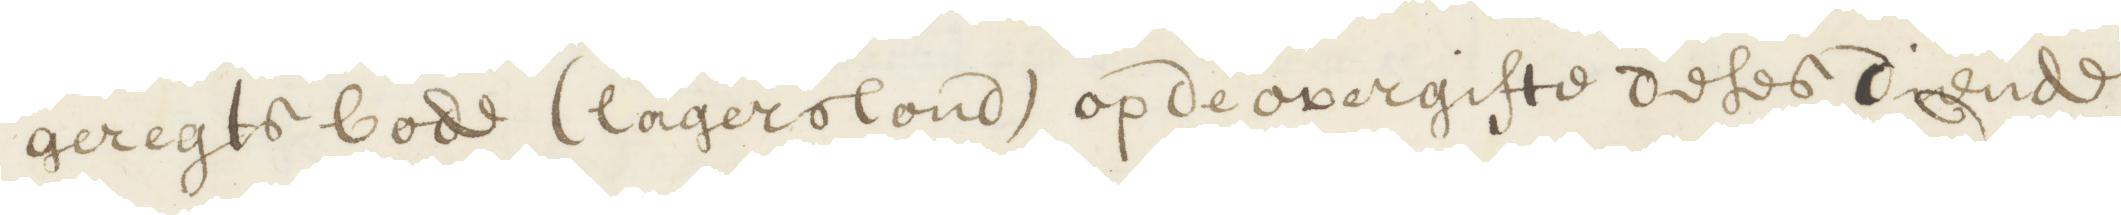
geregts bode (lagerstond) op de overgifte deses diende
